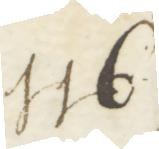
116
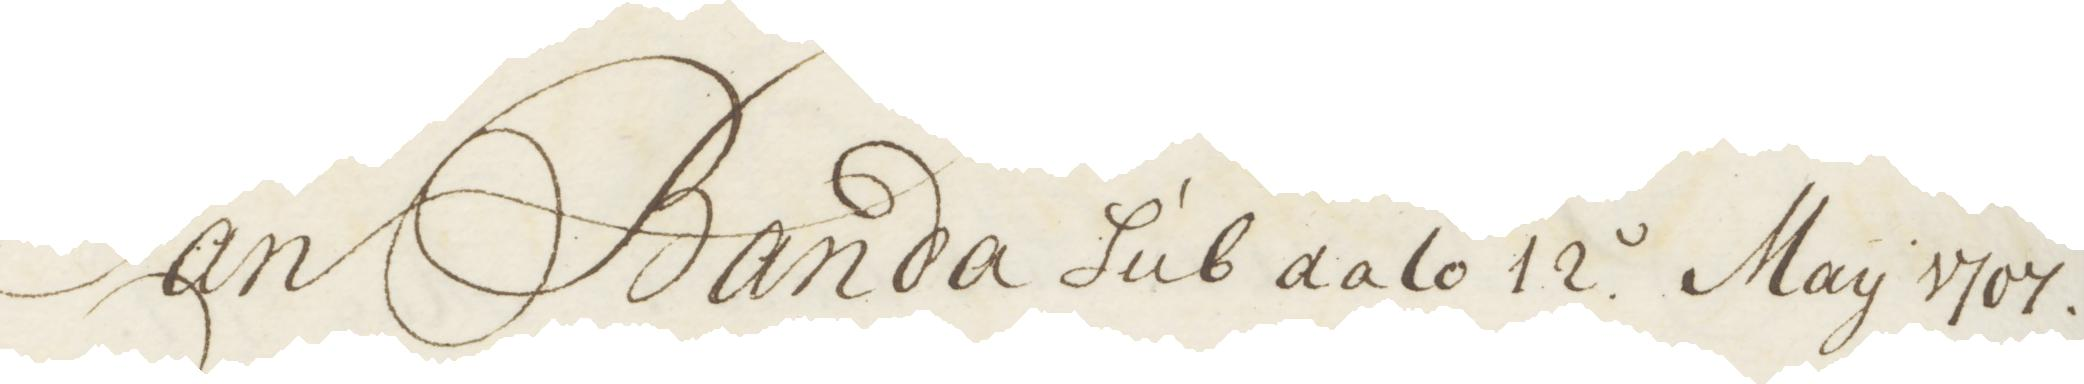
Van Banda sub dato 12.' Maij 1707
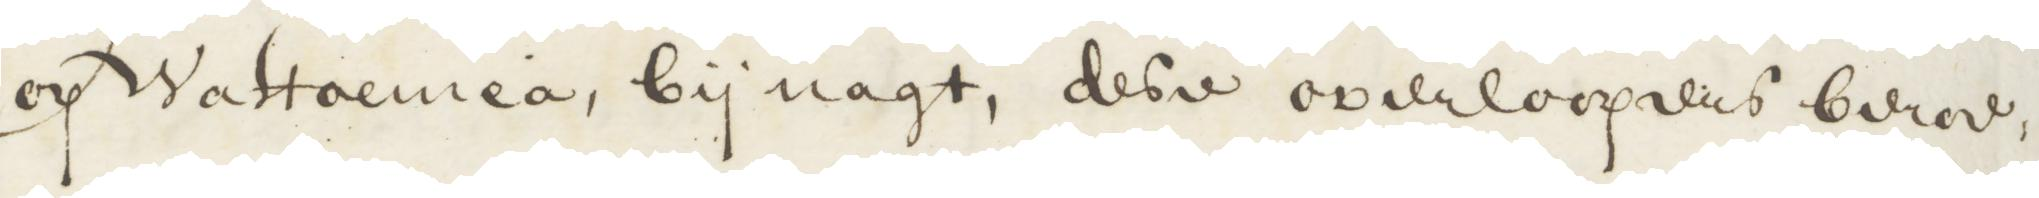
op Wattoemea, bij nagt, dese overloopers beroe„
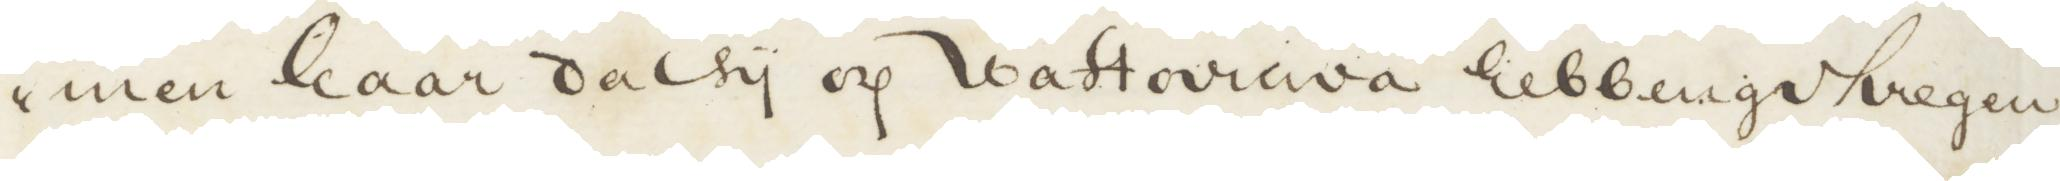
men haar dat sij op wattoemea hebben gekregen
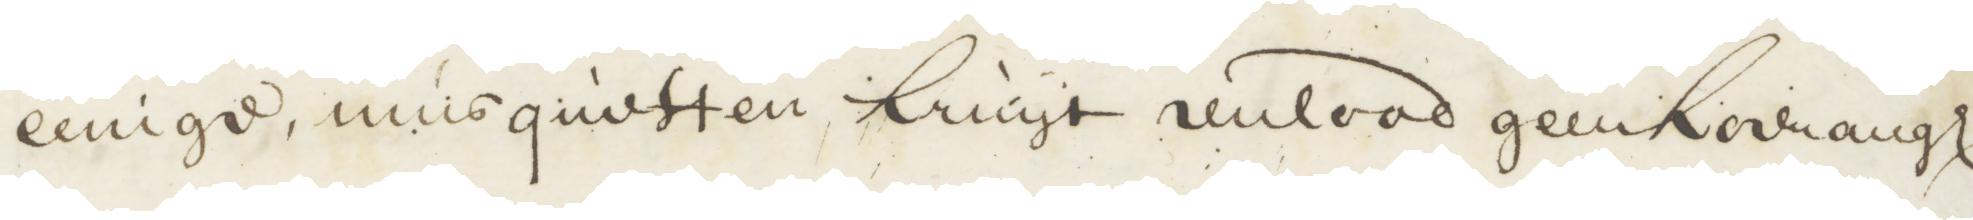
eenige, musquetten, kruijt en lood geen koerangh
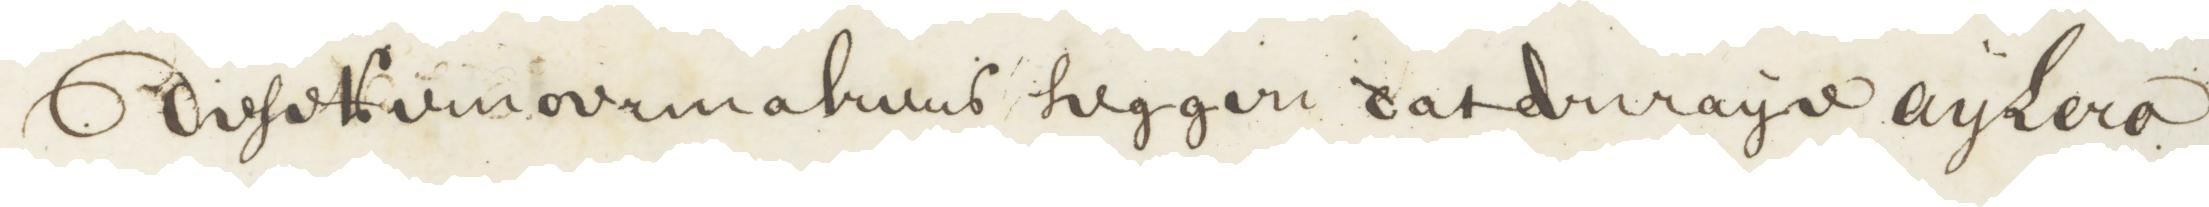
desetsemoermakens seggen dat denraije aijlero
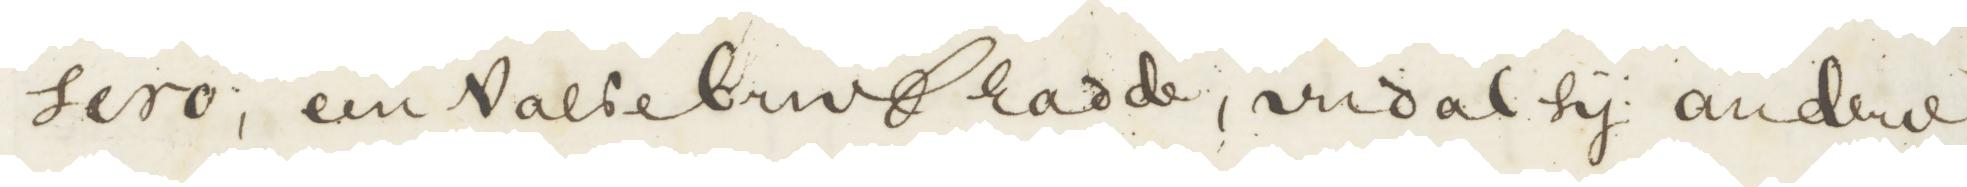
sero; een valse brief hadde, en dat sij andere
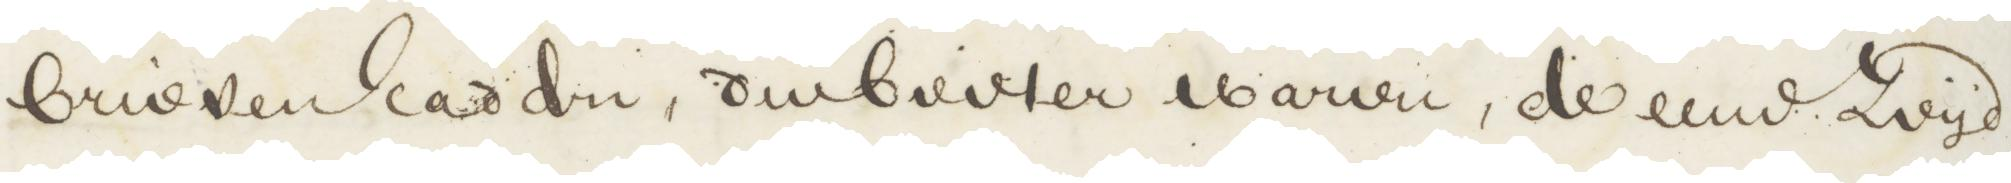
brieven hadden, die beeter waren, de eene zeijd
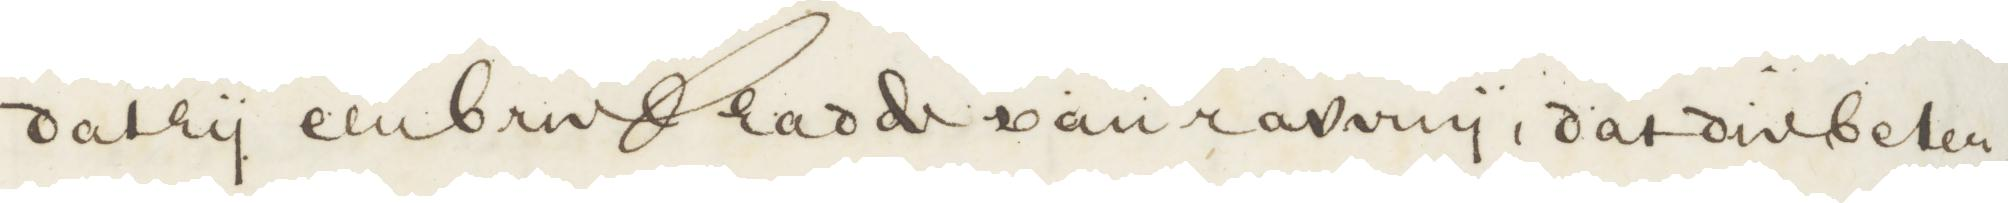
dat hij een brief hadde van ravenij, dat die beter
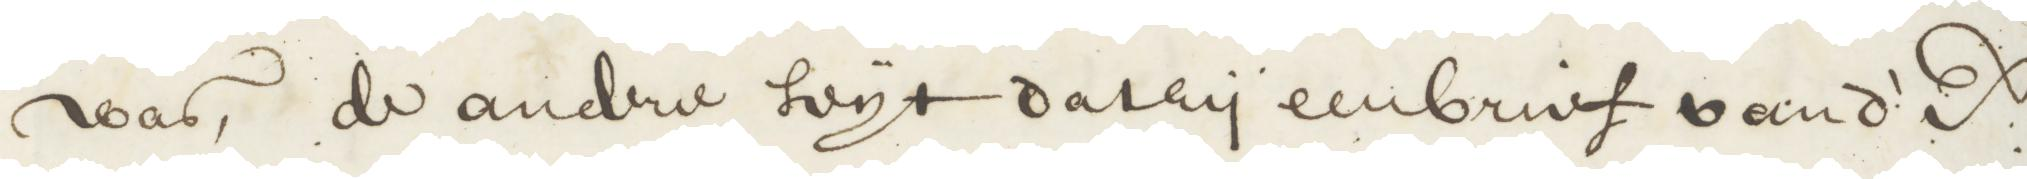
was, de andere seijt dat hij een brief van d’ E
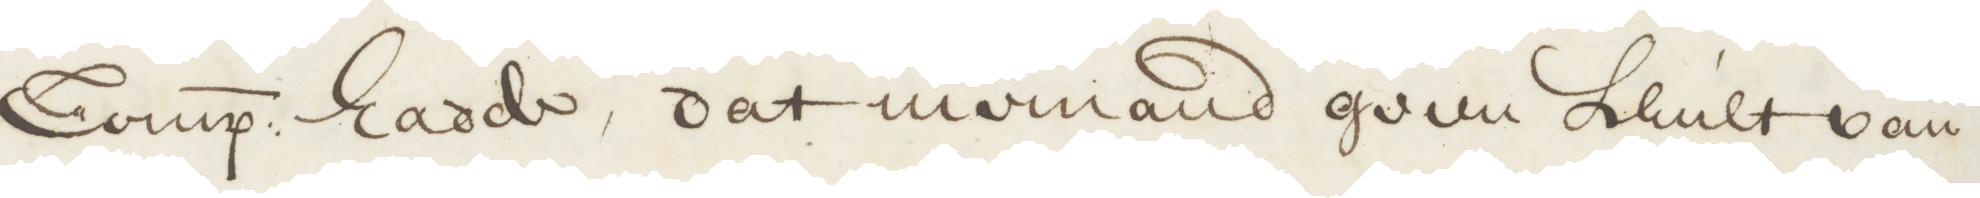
Comp: hadde, dat niemand geen schult van
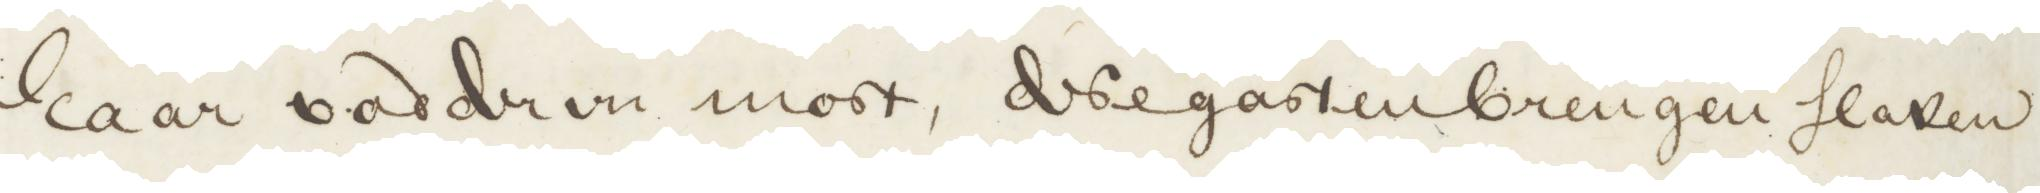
haar vorderen most, dese gasten brengen slaven
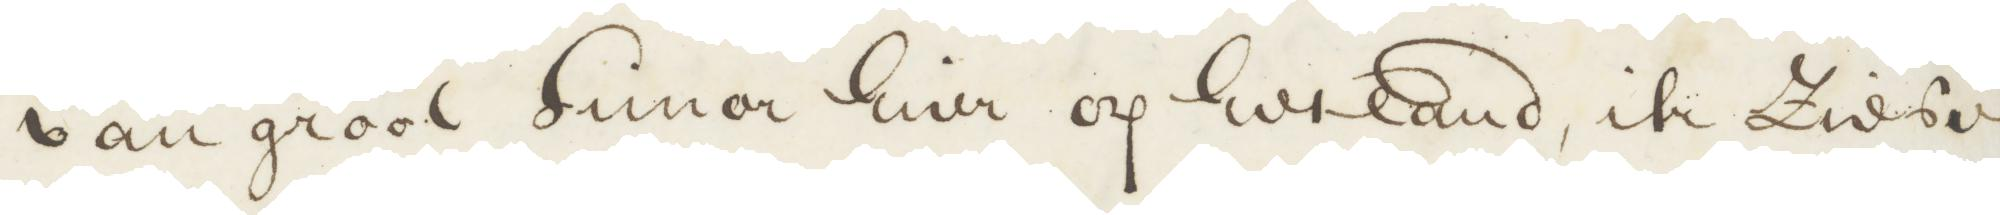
van groot timor hier op het land, ik zie se
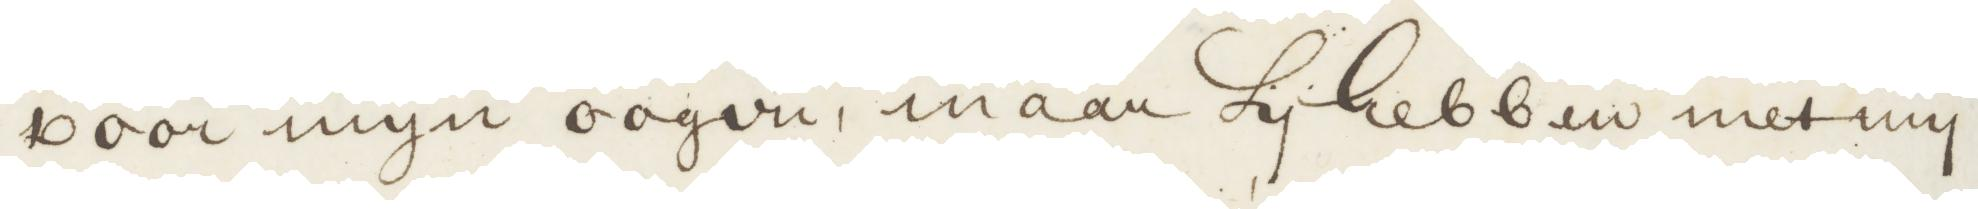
voor mijn oogen, maar sij hebben met mij
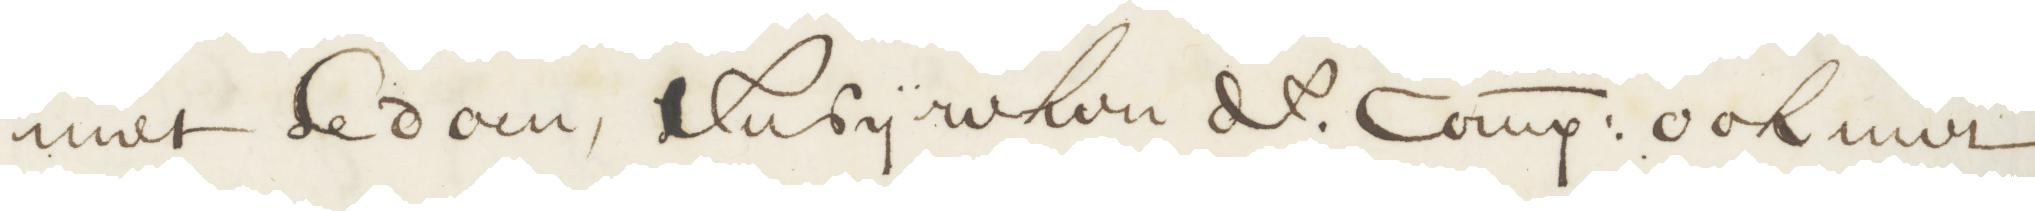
niet te doen, En sij reken d'E. Comp: ook niet
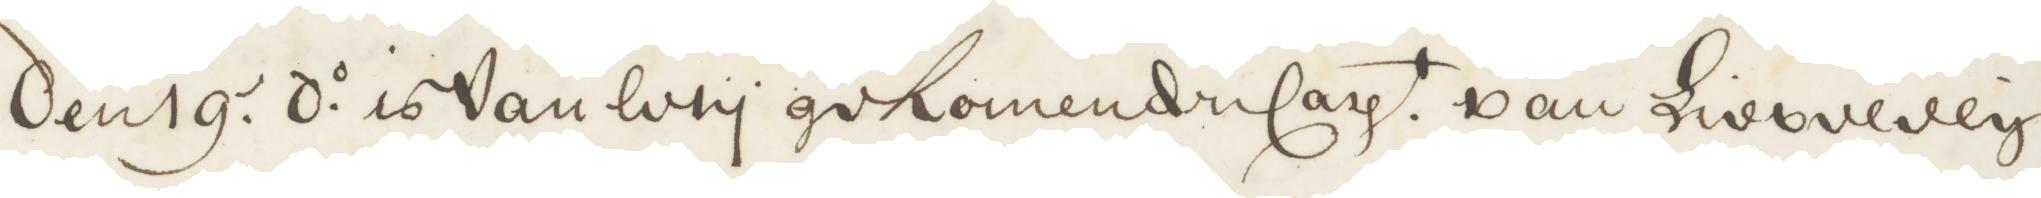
den 19.' d.o is van letij gekomen den Cap.t van Lievelelij
